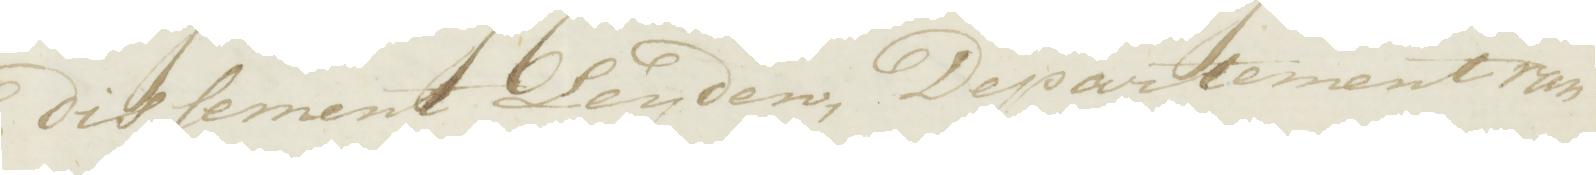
dissement Leyden, Departement van
